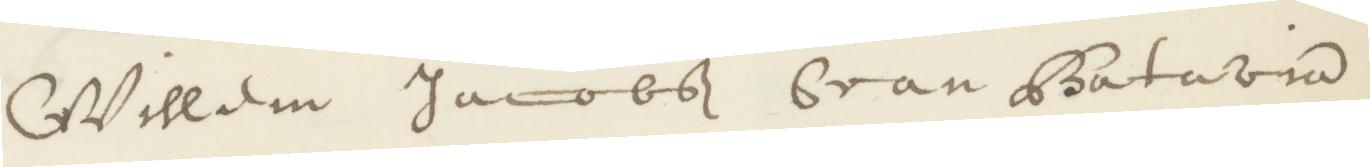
Willem Jacobs Van Batavia
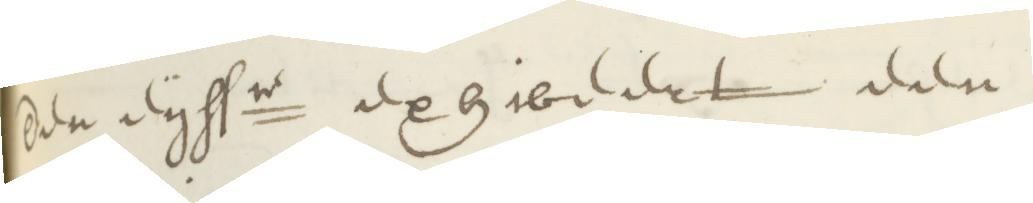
den Eijss=r exhibeert een
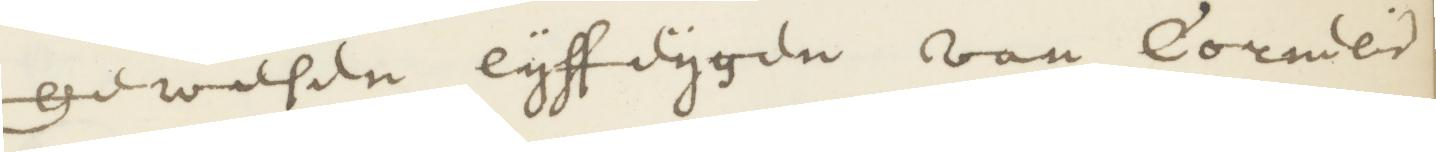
gewesen lijffeijgen van Cornelis
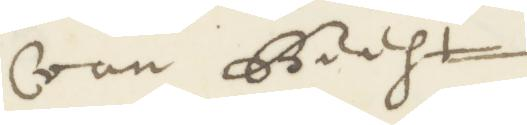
Van Beest — eijss=r
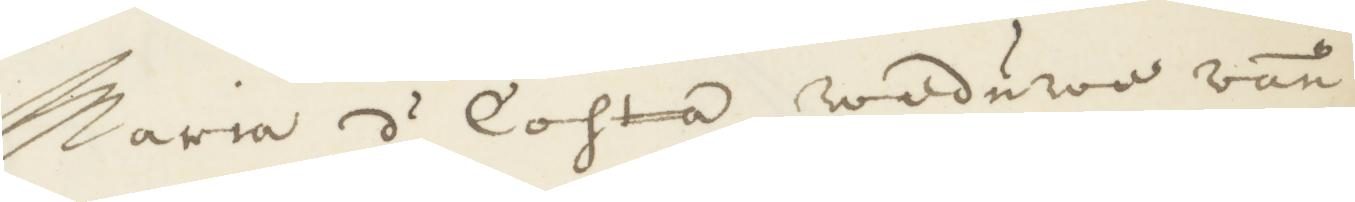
Maria d’ Costa weduwe van
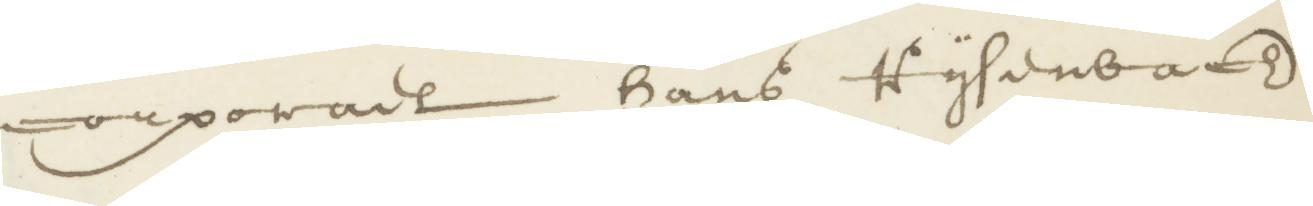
corporael hans Rijsenbach
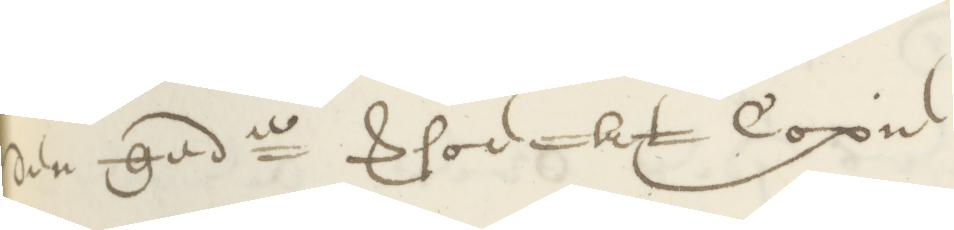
den ged=e versoeckt Copie
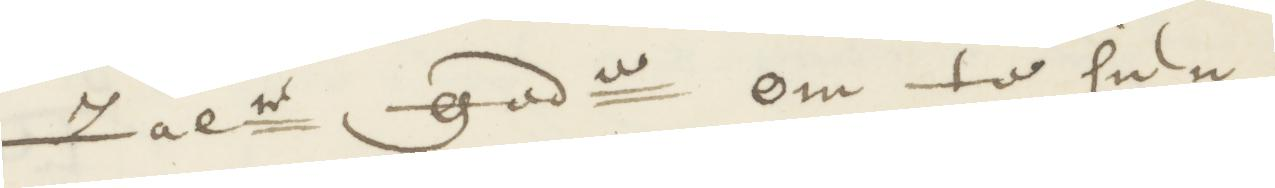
zal=r ged=e om te sien
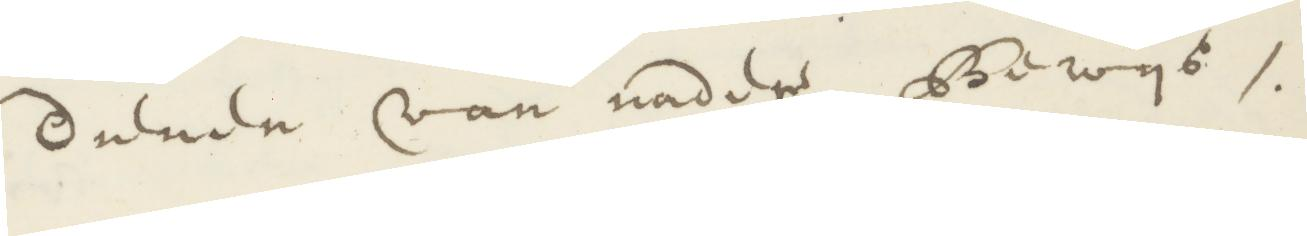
dienen van nader Bewijs /.
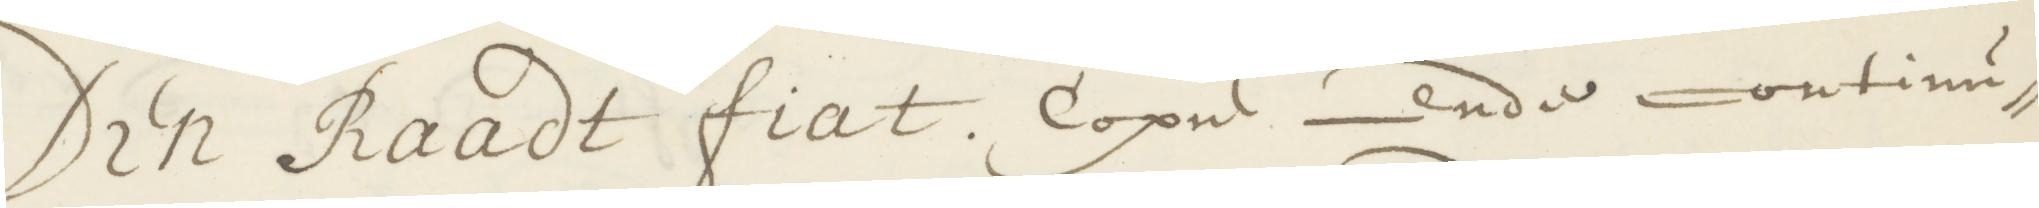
Den Raadt fiat. Copie Ende continu„
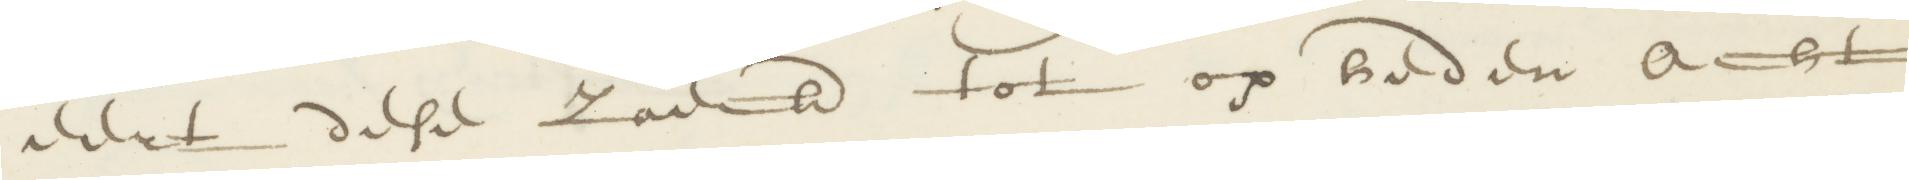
eert dese zaeck tot op heden acht
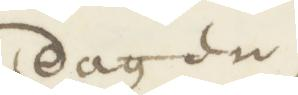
dagen
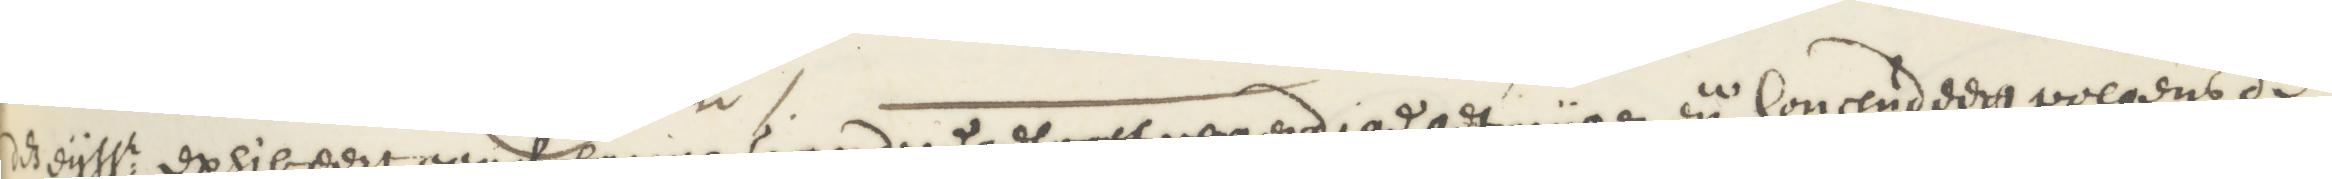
den eijss:r exhibeert een verclaringe van drie gelooffwaerdige getuijgen en Concludeert volgens de
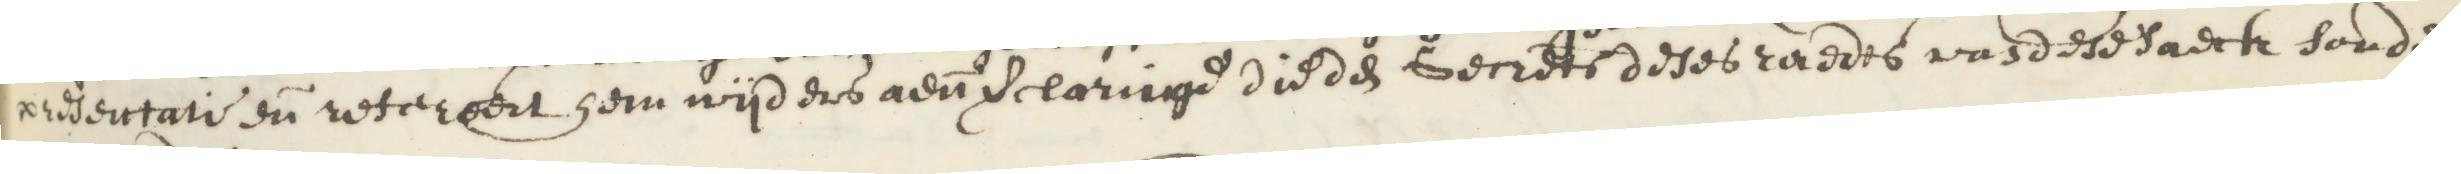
presentatie en refereert hem wijders aen verclaringe die den Secrets deses raedts van dese saeck soude
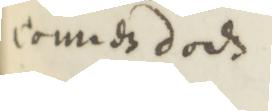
connen doen
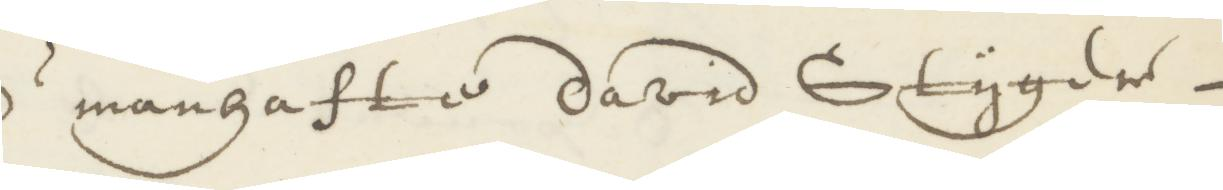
D manhafte david Stijger —
